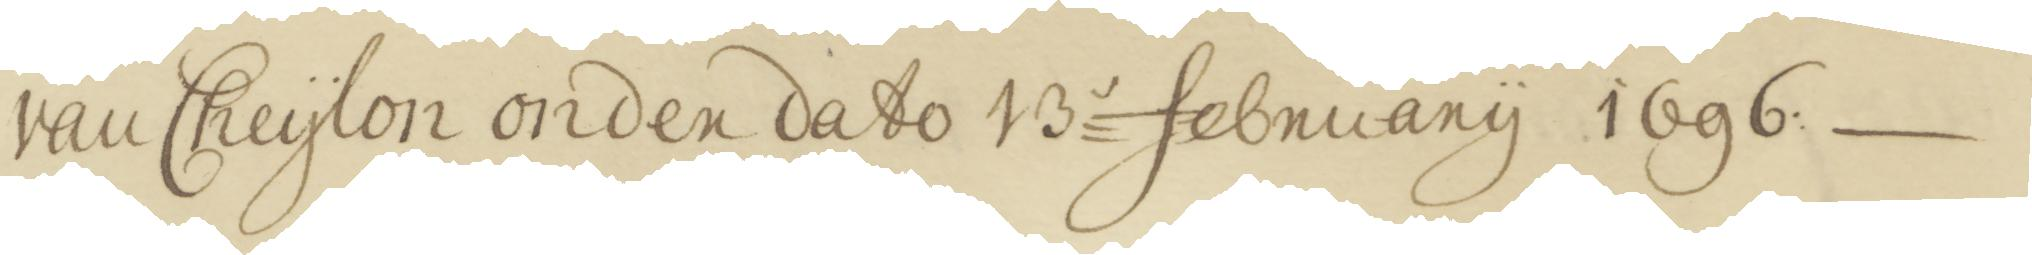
van Cheijlon onder dato 13=e februarij 1696: —
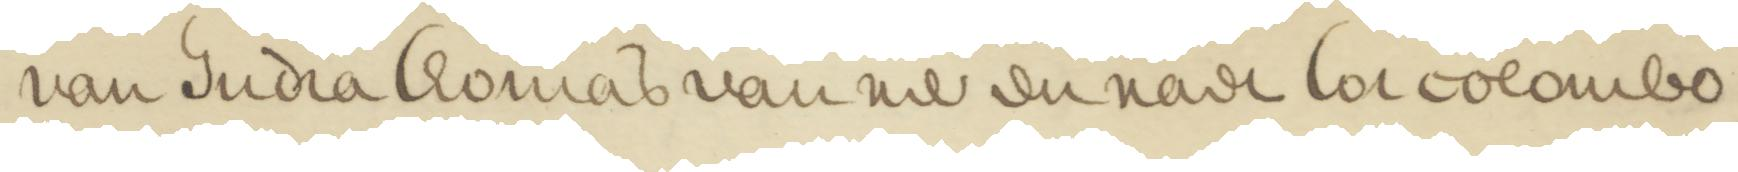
van India thomas van re en raet tot colombo
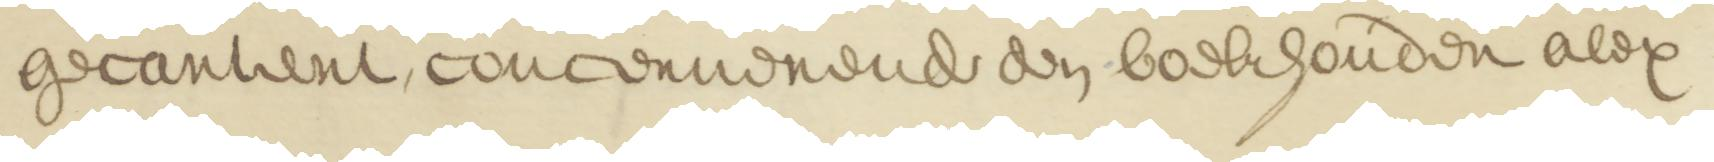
gecartert, concernerende den boekhouder alex
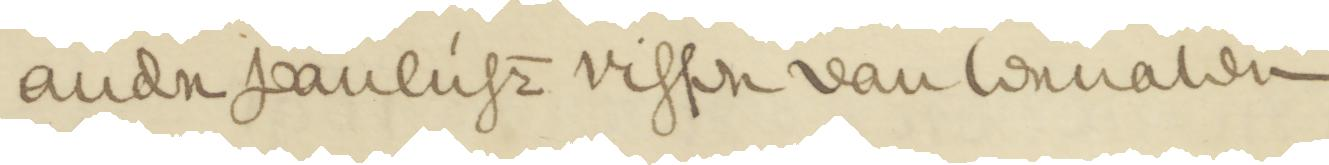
ander paulusz visser van ternaten
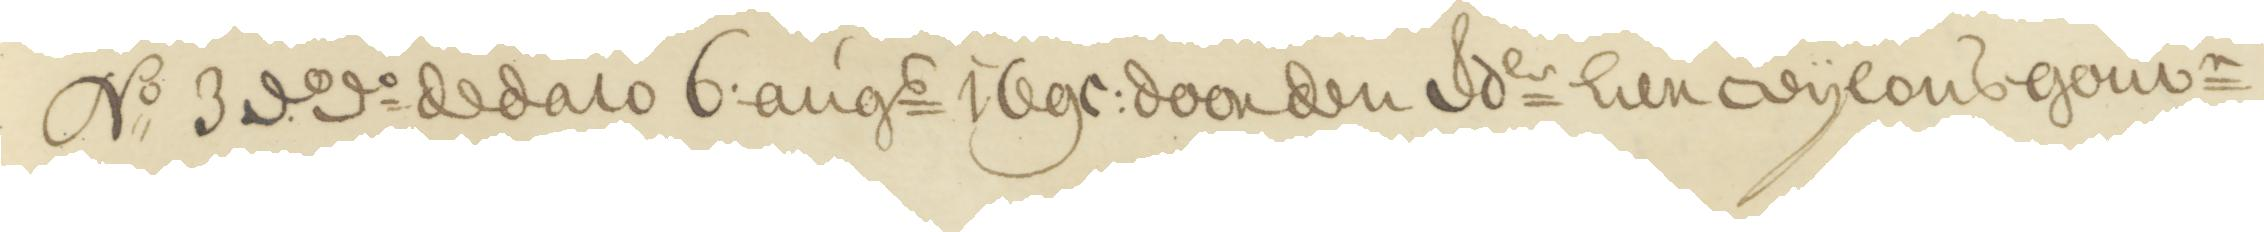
N„o 3 d=o d=o dedato 6. aug=s 1695: door den Ed=le her ceijlons gouv=r
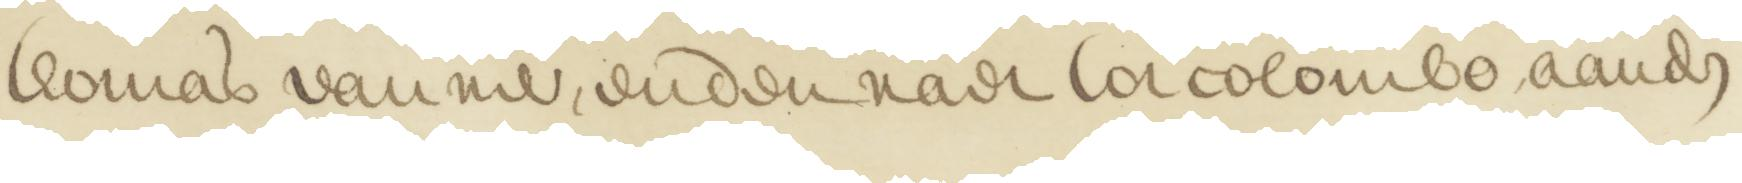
thomas van re, enden raet tot colombo, aanden
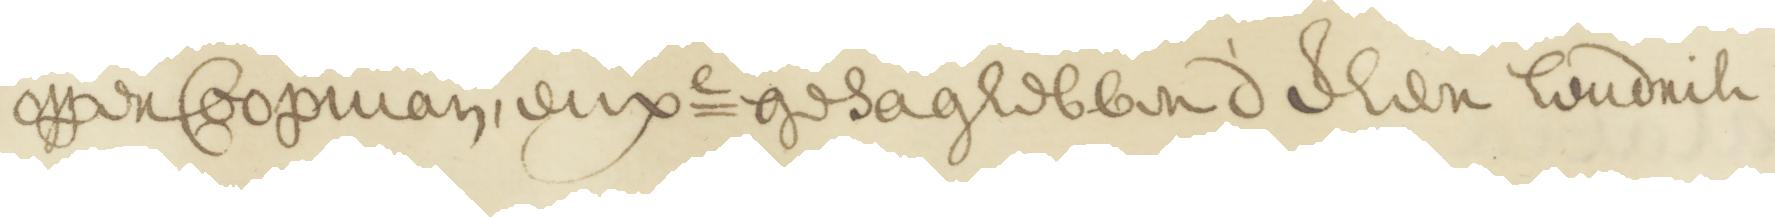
oppercoopman, enp=l gesaghebber d’ Eher hendrik
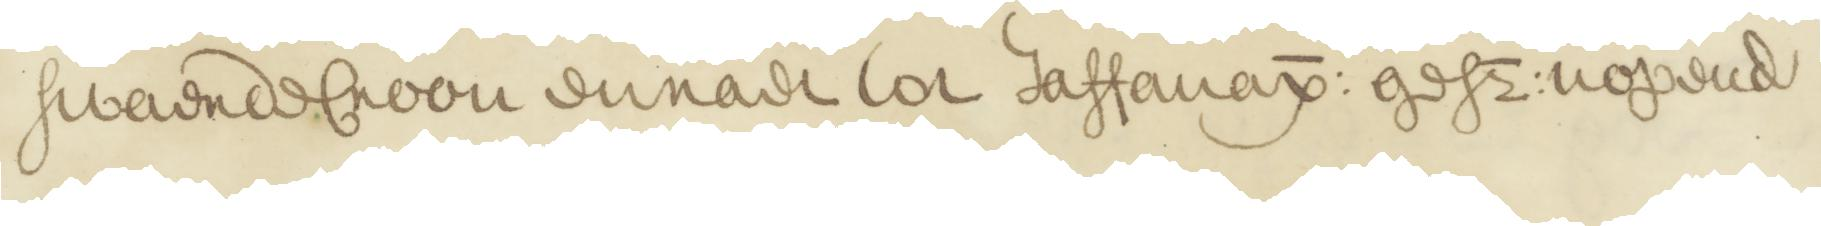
swaerdecroon enraet tot Iaffanap: gesz: nopende
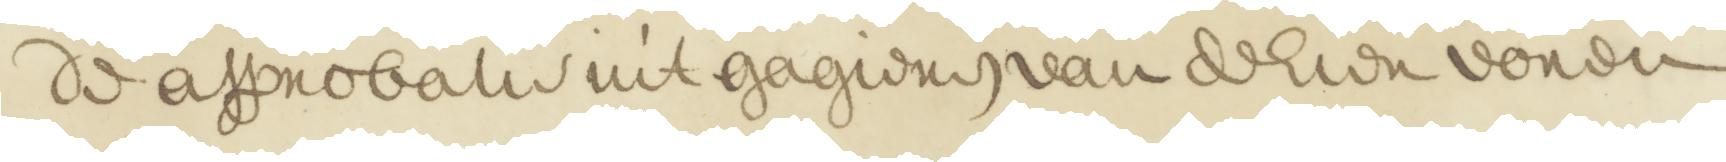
de approbatie in’t gagieren van dehier voren
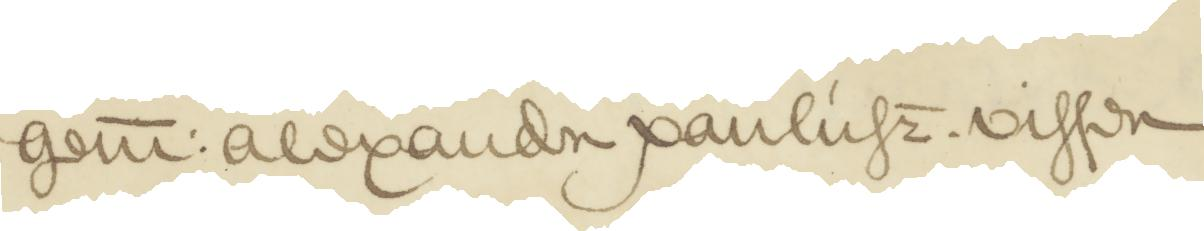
gem: alexander paulusz. visser
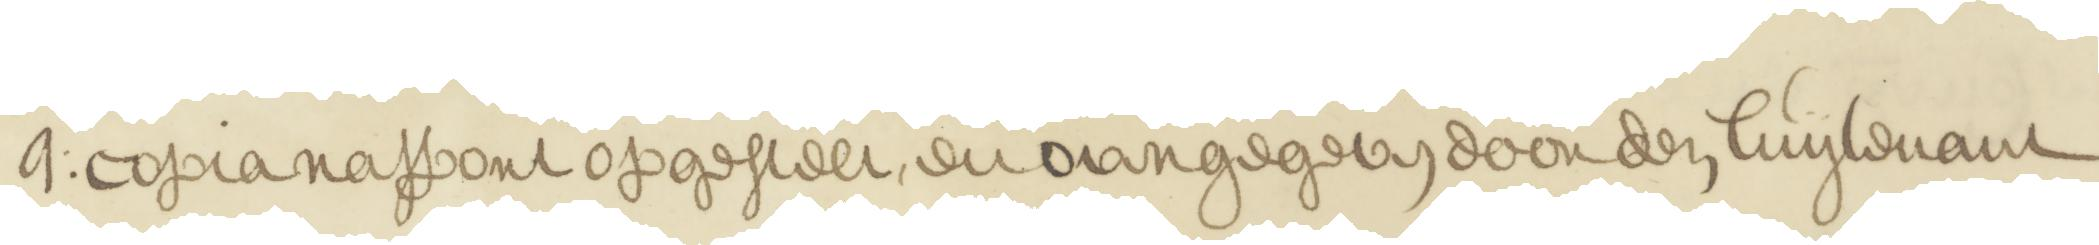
4: copia rapport opgestelt, en overgegeven door den luijtenant
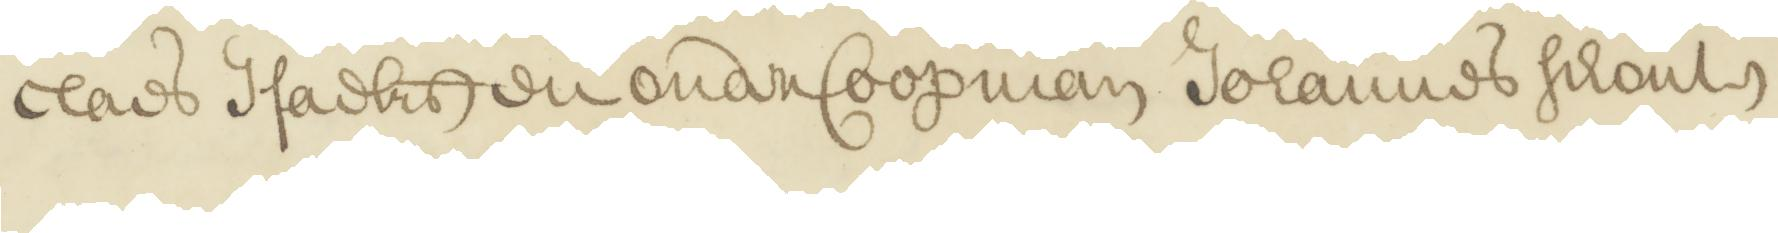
claes Isaeks en ondercoopman Johannes schouten
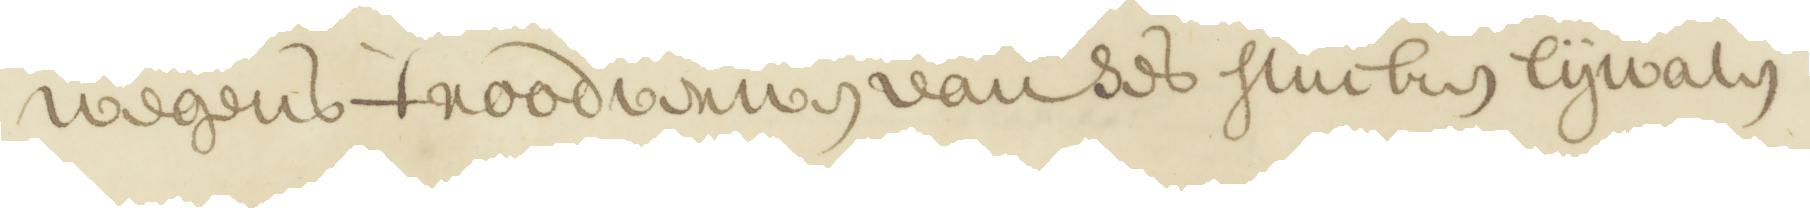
wegens 'troodverwen vanses stucken lijwaten
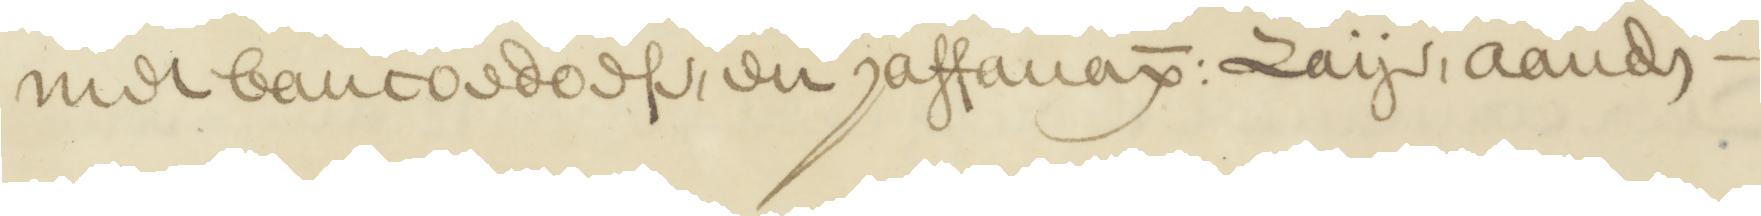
met bancoedoese, en jaffanap: zaije, aanden -
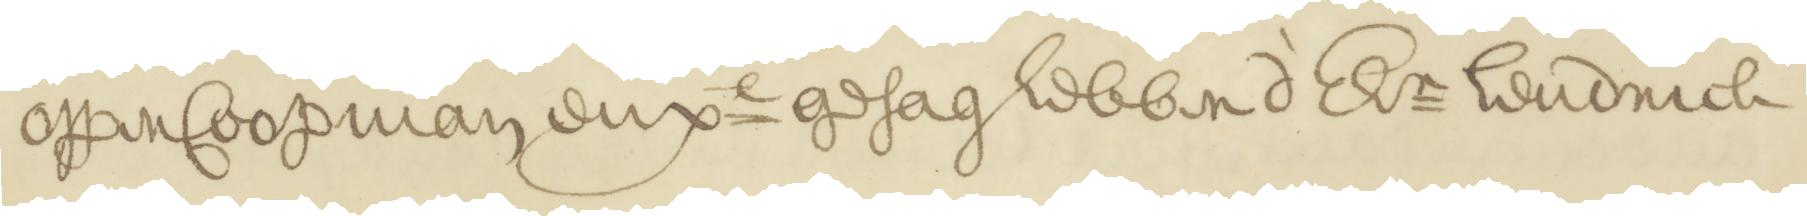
oppercoopman en p=l gesaghebber d’ Eh=r hendrick
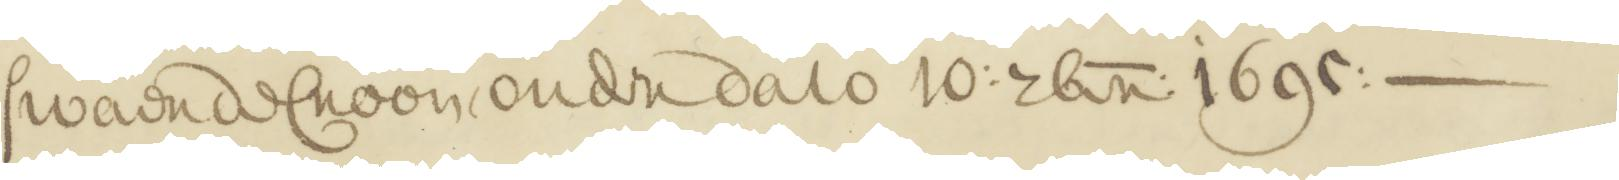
swaerdeCroon, onder dato 10: 7ber: 1695: —
